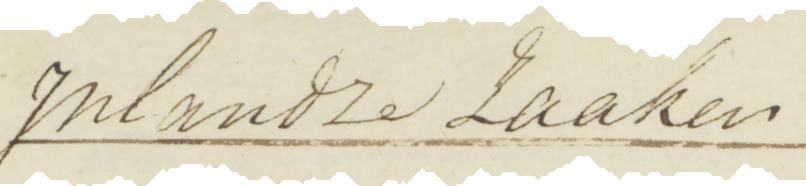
Inlandze zaaken
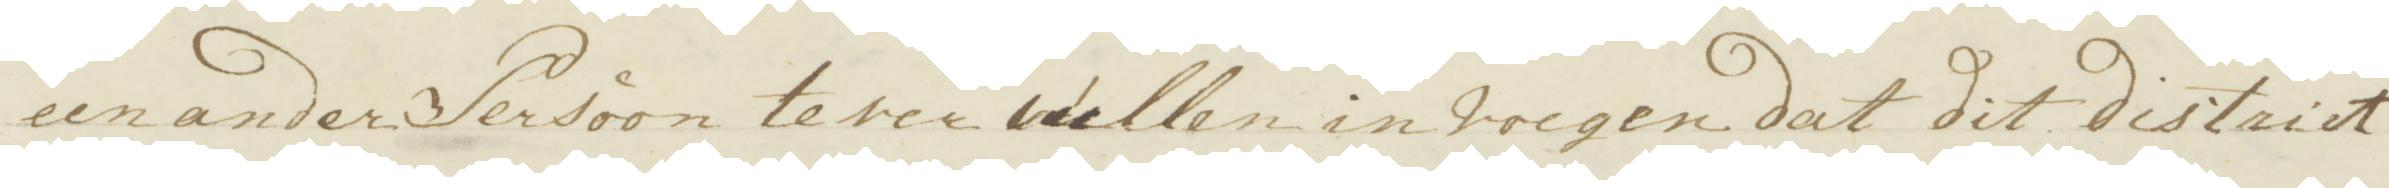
een ander Persoon te vervullen in voegen dat dit district
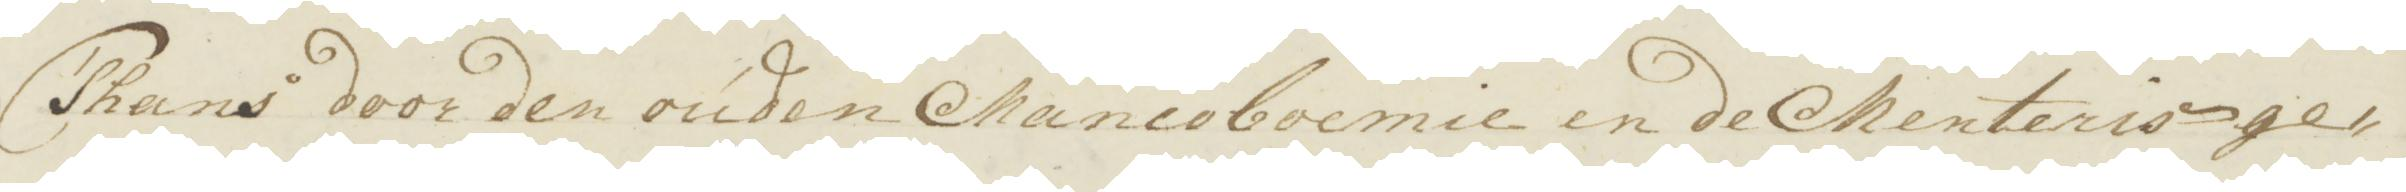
Thans door den ouden Mancoboemie en de Menterisen ge„
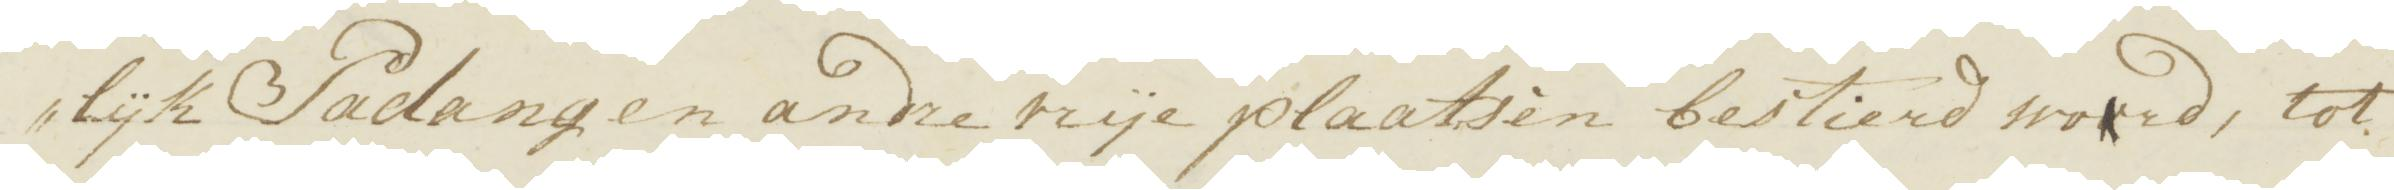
„lijk Padang en andre vrije plaatsen bestierd word, tot
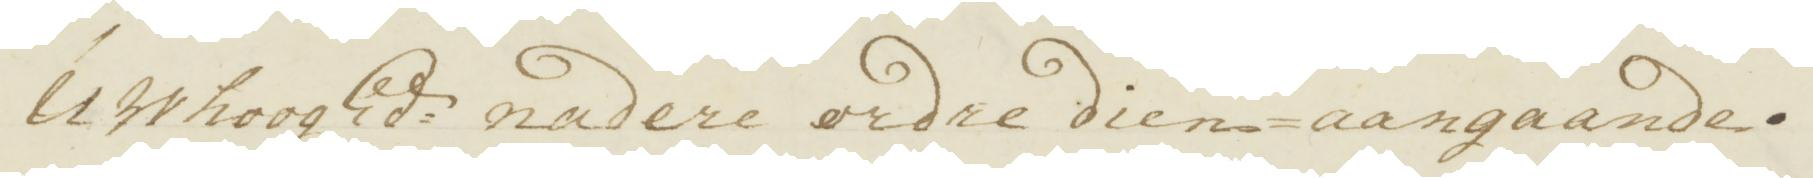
Uw hoogEd=s nadere ordre dien aangaande.
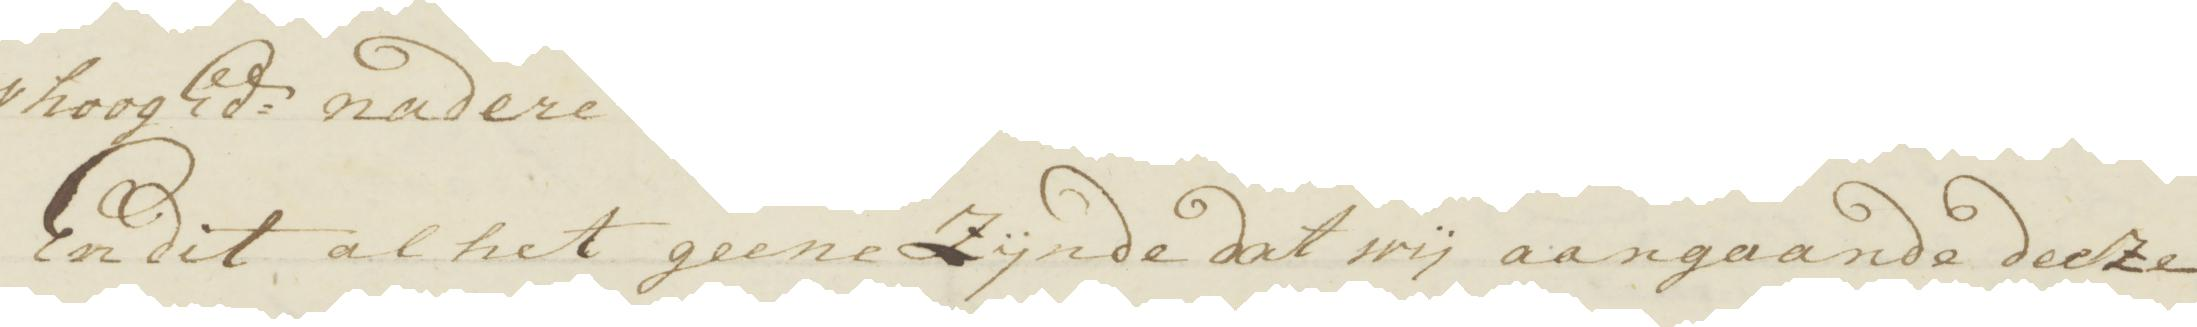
En dit al het geene zijnde dat wij aangaande deeze
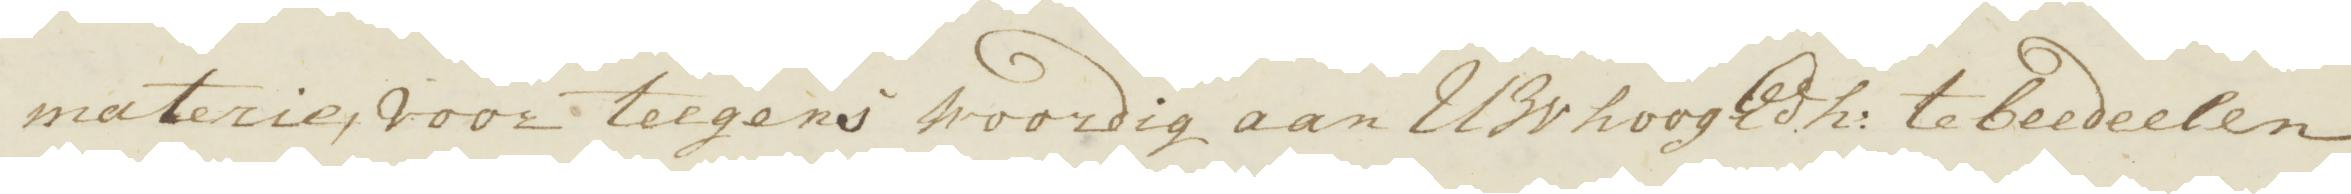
materie, voor teegens woordig aan Uw hoog Edh: te beedeelen
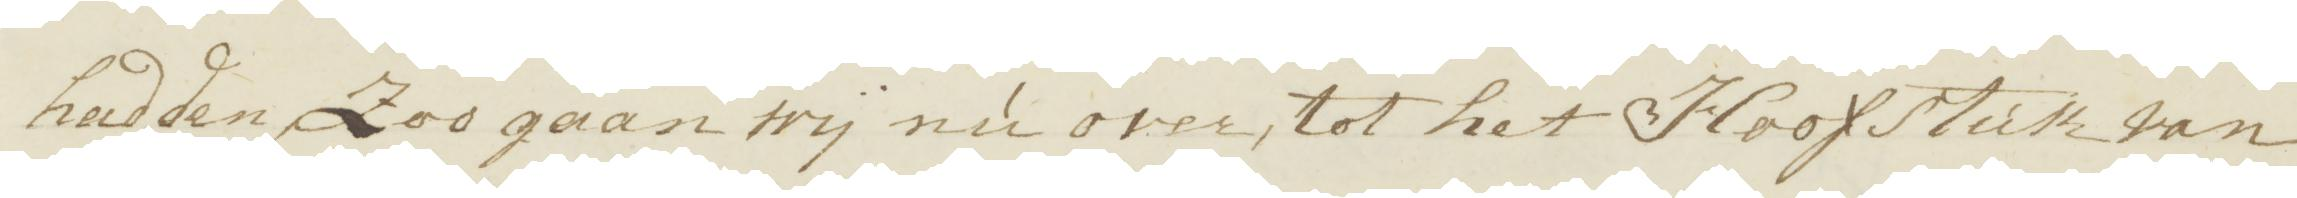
hadden, zoo gaan wij nu over, tot het Hoofstuk van
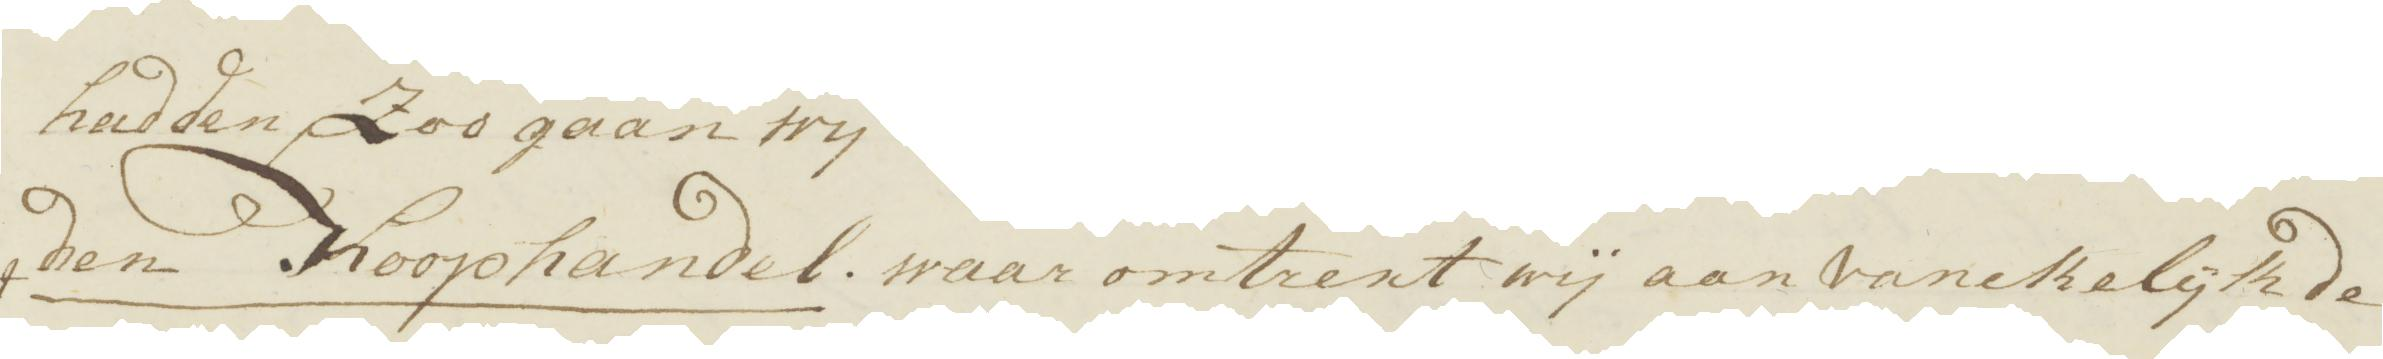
den Koophandel. waar omtrent wij aanvanckelijk de
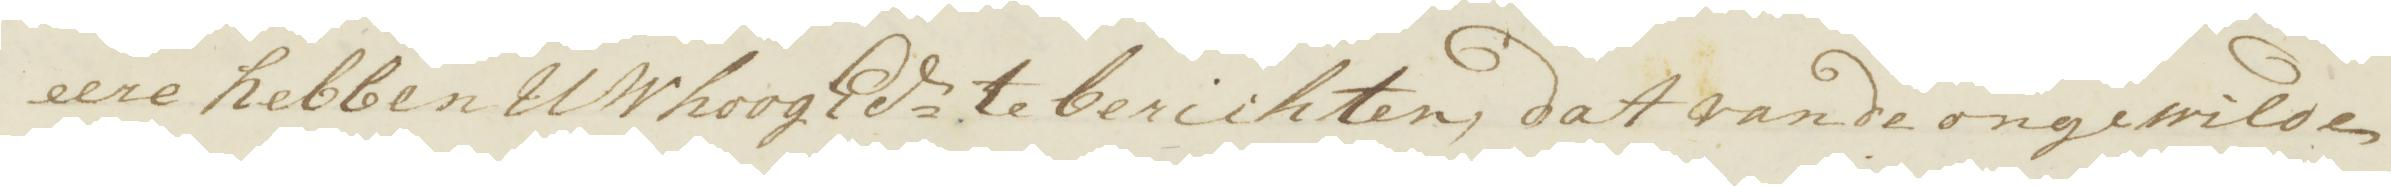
eere hebben Uw hoog Ed= te berichten, dat van de ongewilde
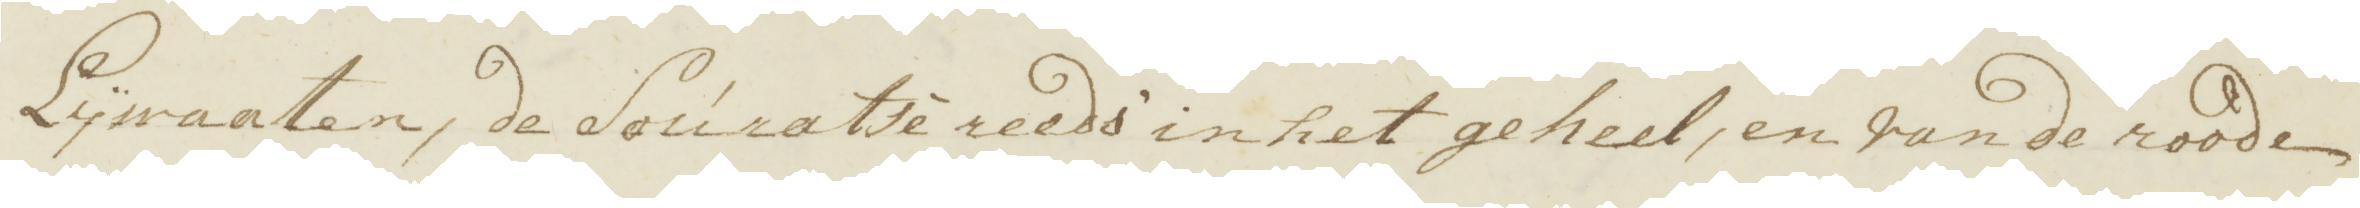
Lijwaaten, de souratse reeds' in het geheel, en van de roode
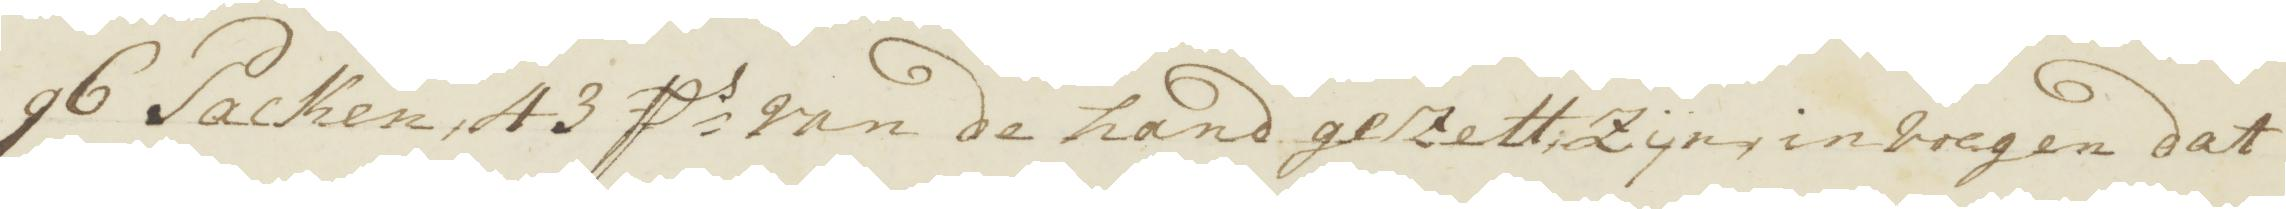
96 Packen, 43 p=s van de hand gezett, zijn, in voegen dat
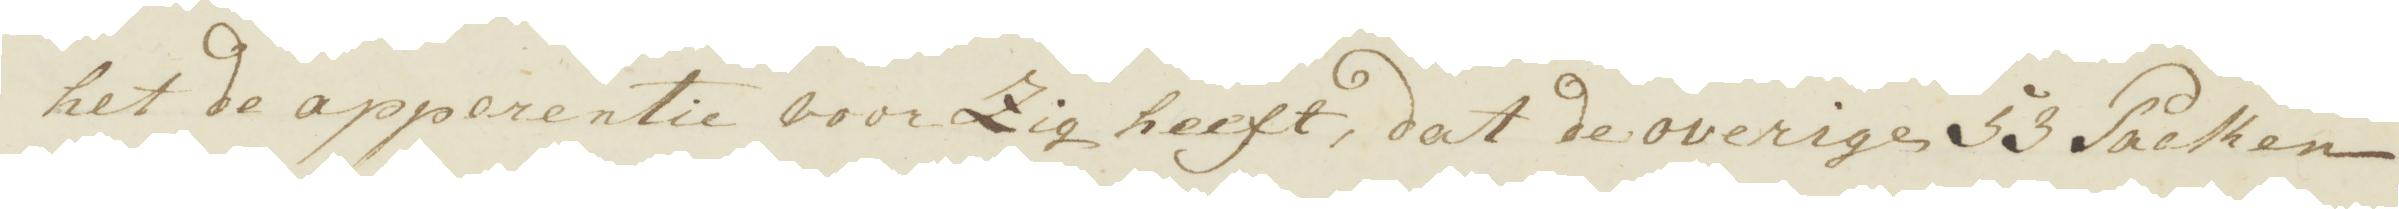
het de apperentie voor zig heeft, dat de overige 53 Packen
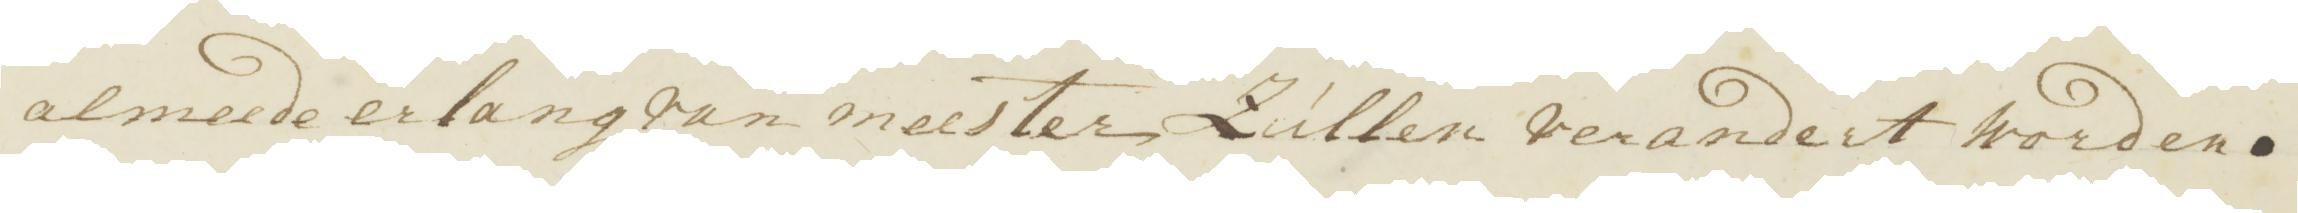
almeede erlang van meester zullen verandert worden.
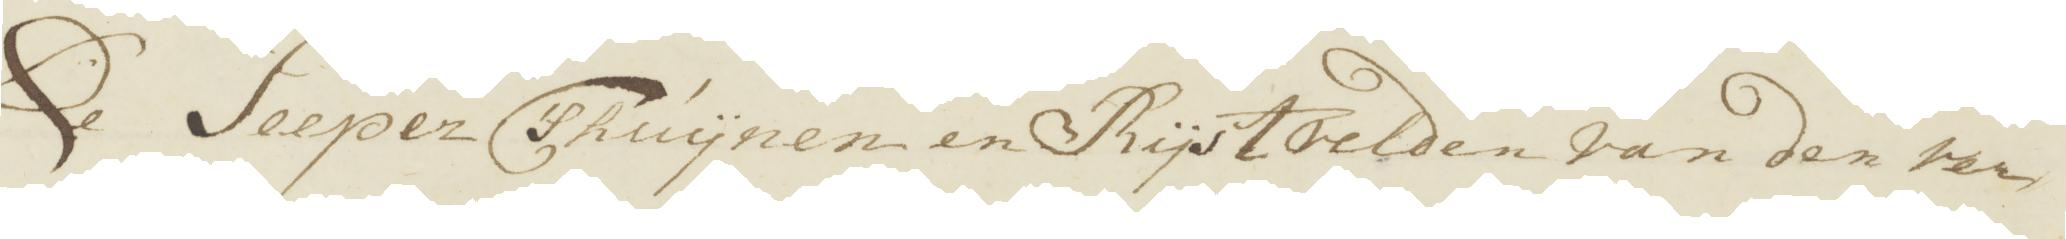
De Peeper Thuijnen en Rijstvelden van den ver„
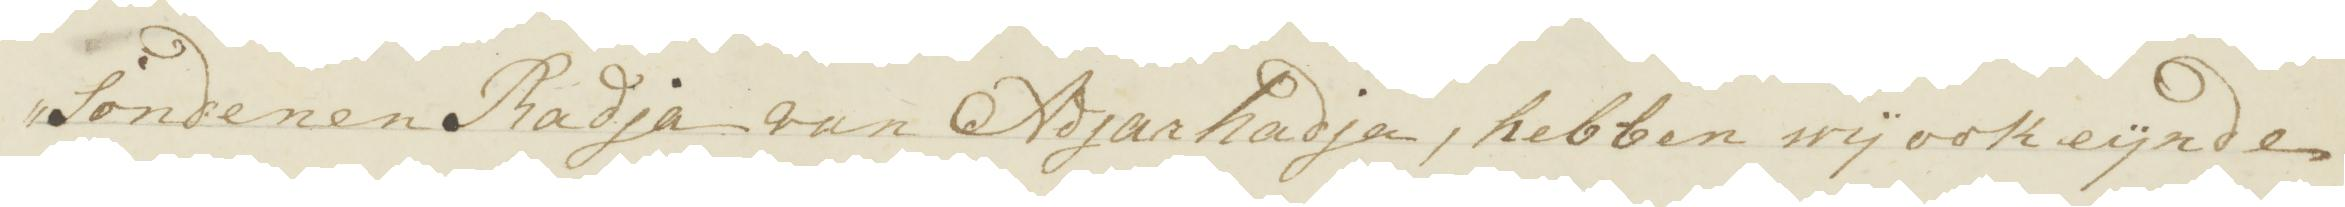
„sondenen Radja van Adjarhadja, hebben wij ook eijnde
